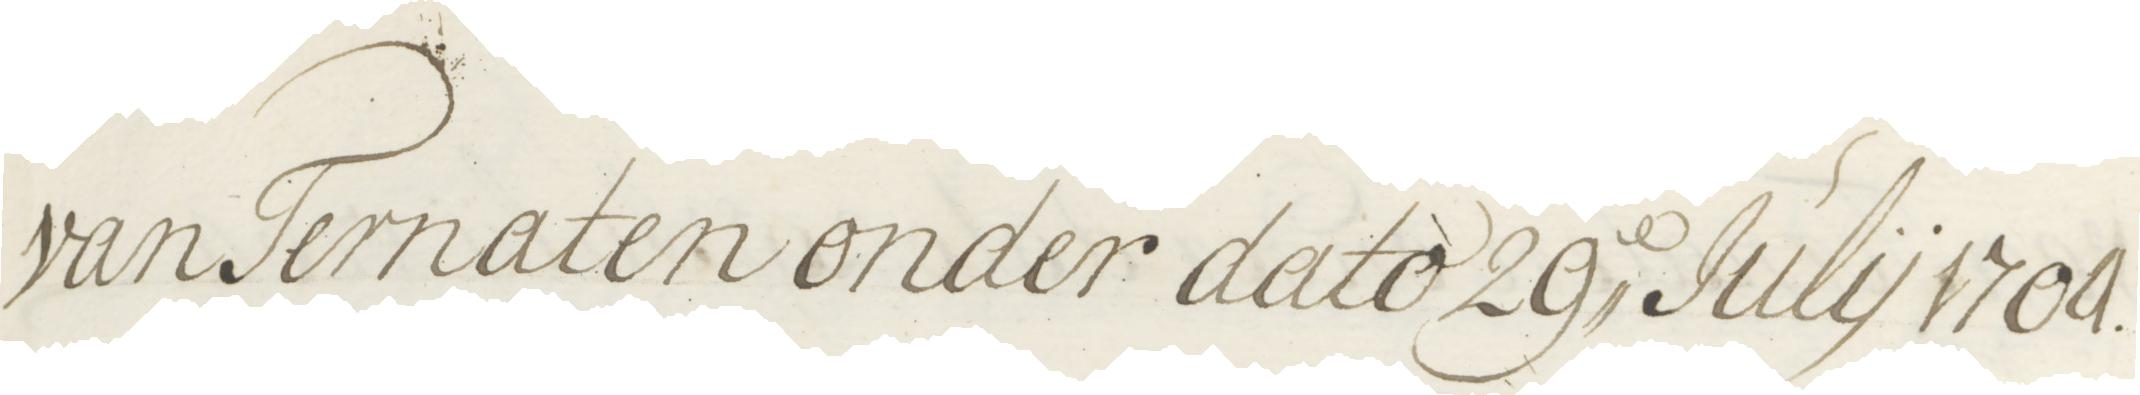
van Ternaten onder dato 29„e Iulij 1704.
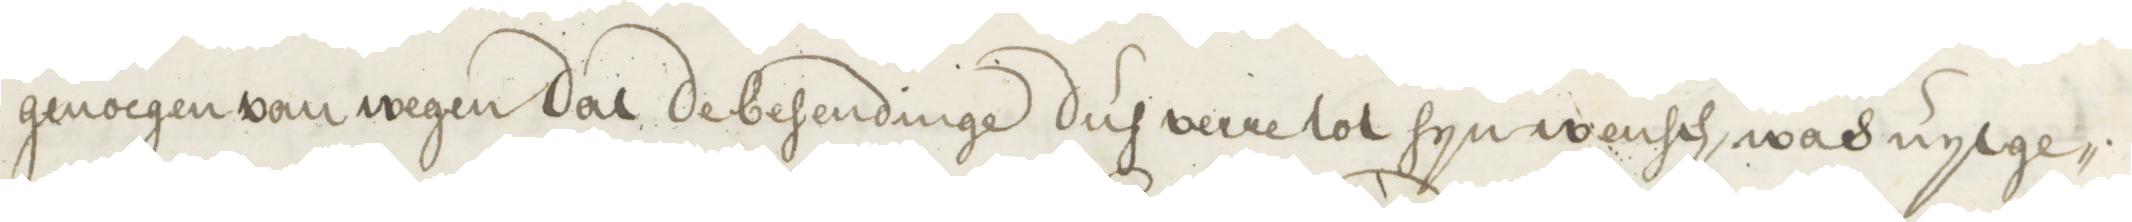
genoegen van wegen dat de besendinge dus verre tot sijn wensch was uytge„.
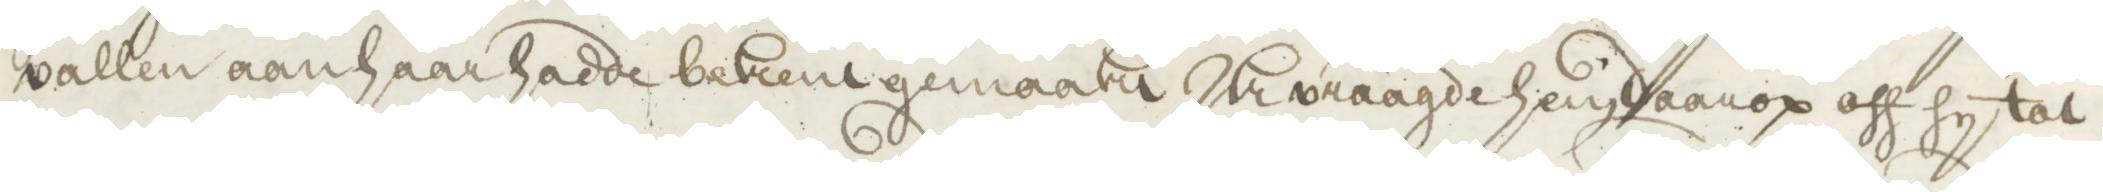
vallen aan haar hadde bekent gemaakt Jk vraagde hem daar op off sij tot
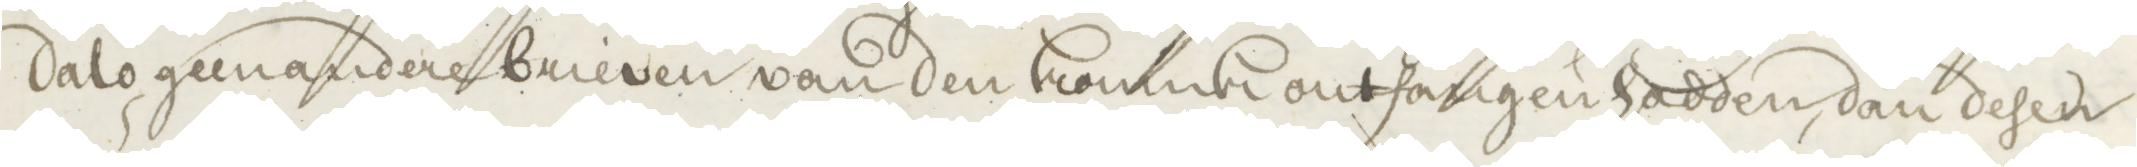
dato geen andere brieven van den konink ontfangen hadden, dan desen
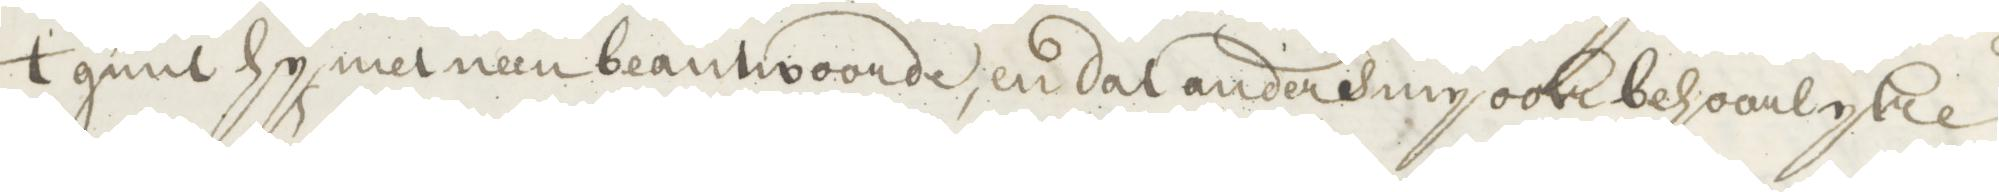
't gunt hij met neen beantwoorde, en dat anders my ook behoorlyke
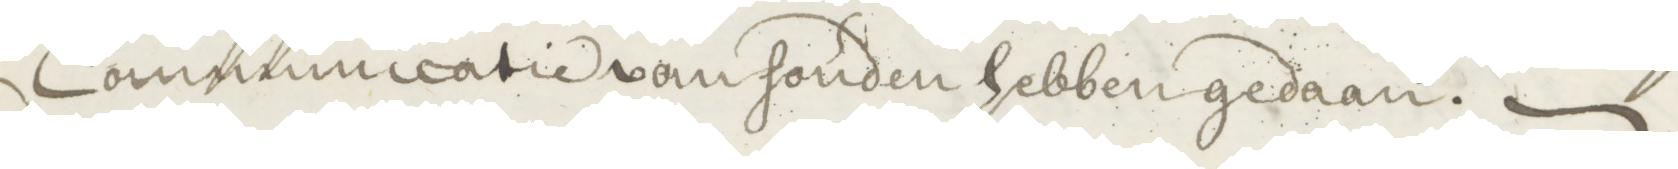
Communicatie van souden hebben gedaan. —
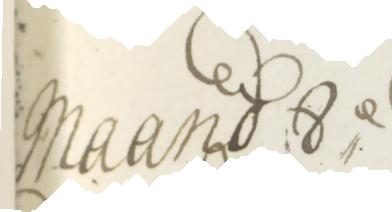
Maand: 8„'
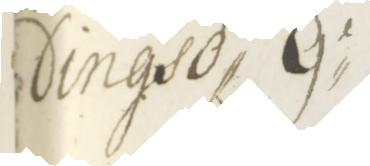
dingsd„' 9„'
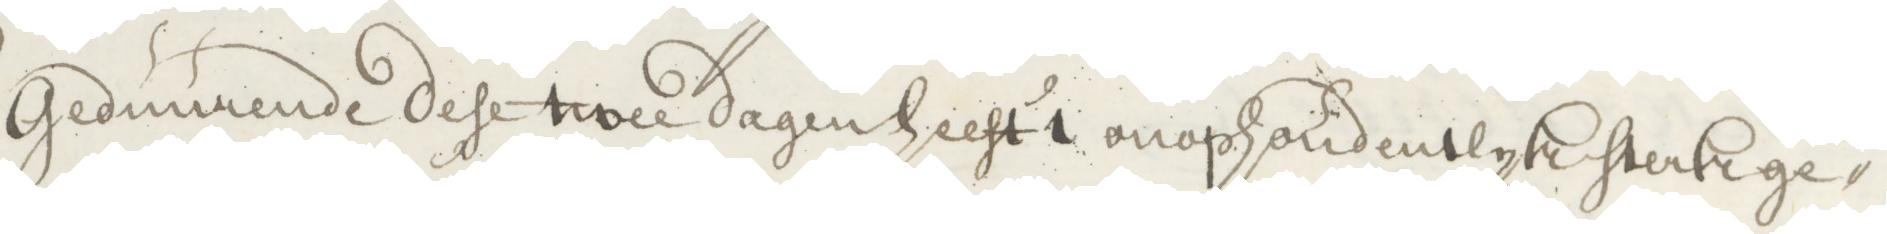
Geduurende dese twee dagen heeft 't onophoudentlyk sterk ge„
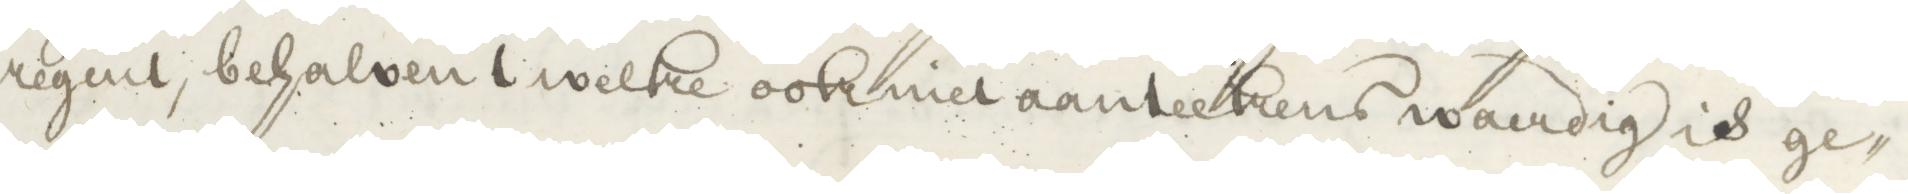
regent, behalven 't welke ook niet aanteekens waerdig is ge„
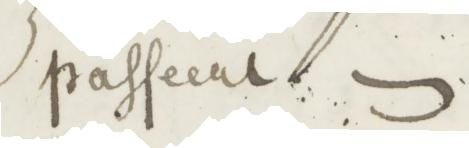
passeert. —
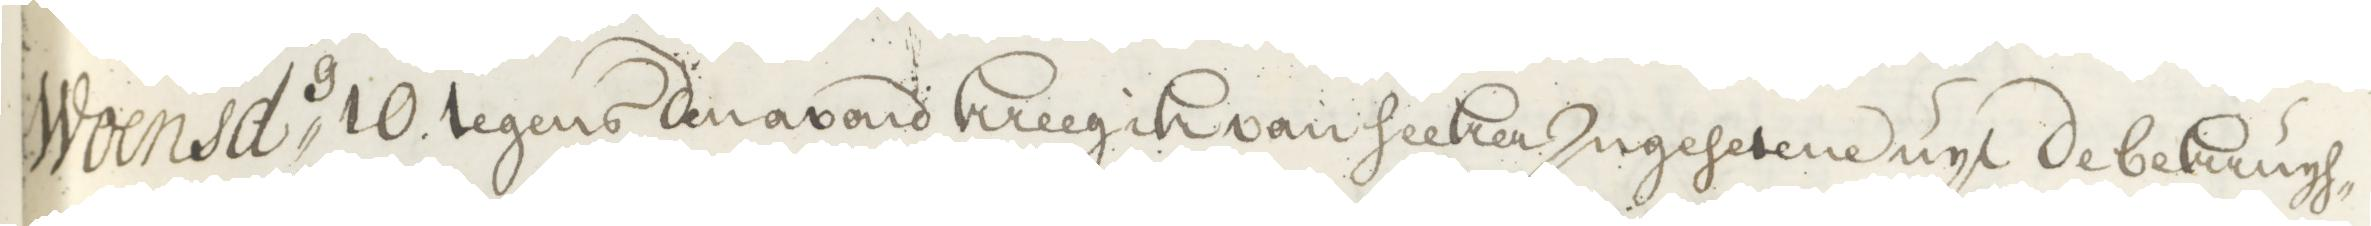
Woensd„g 10. tegens den avond kreeg ik van seeker Jngesetene uijt de bekruys„
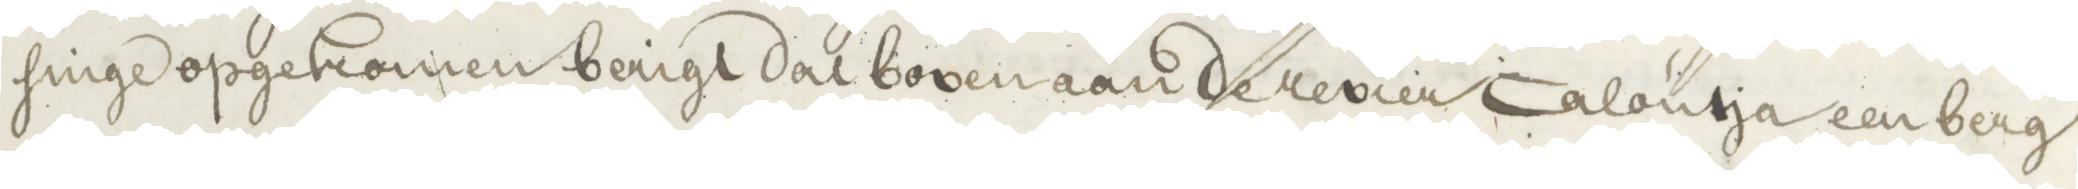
singe opgekomen berigt dat boven aan de revier Caloutja een berg
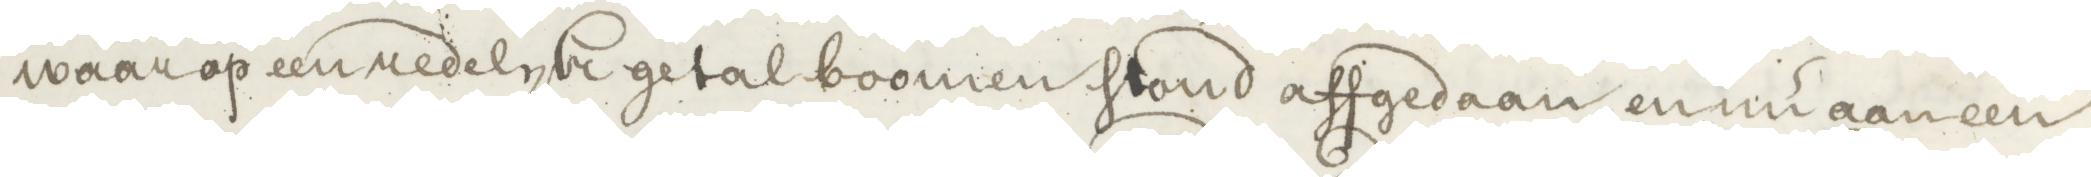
waar op een redelyk getal boomen stond affgedaan, en nu aan een
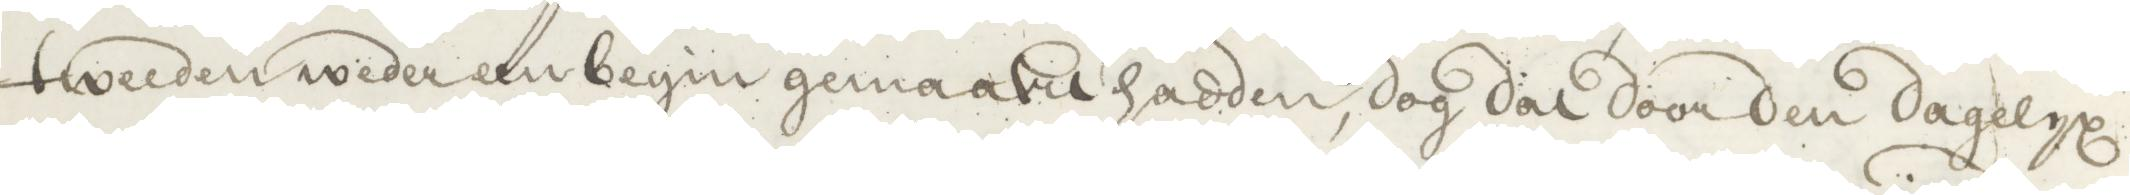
tweeden weder een begin gemaakt hadden, dog dat door den dagelyx
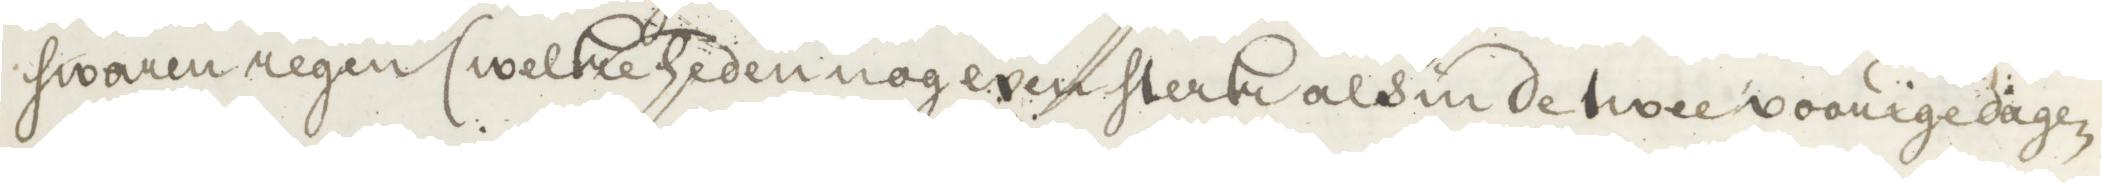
swaren regen (welke heden nog even sterk als in de twee voorige dagen
